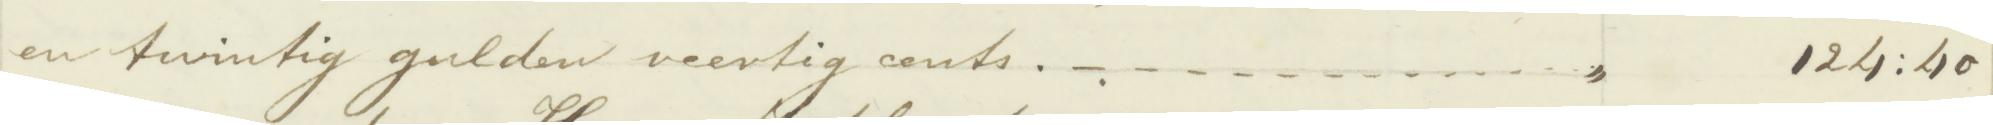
en twintig gulden veertig cents. - - - - - - - - - - - - - „ 124: 40
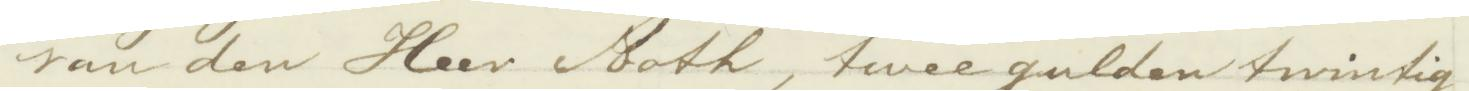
van den Heer Noth, twee gulden twintig
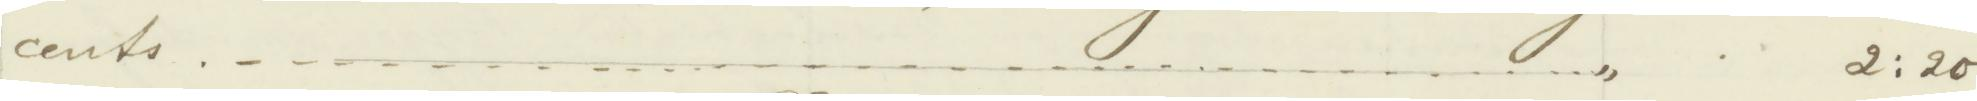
cents. - - - - - - - - - - - - - - - - - - - - - - . - - - - - - - - . . „ 2: 20
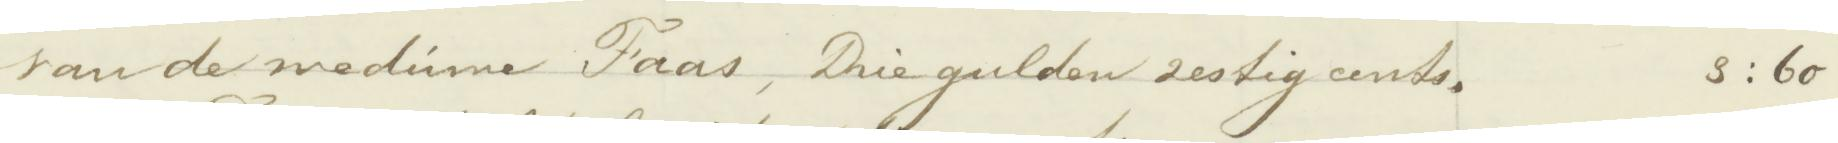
van de weduwe Faas, Drie gulden zestig cents„ 3: 60
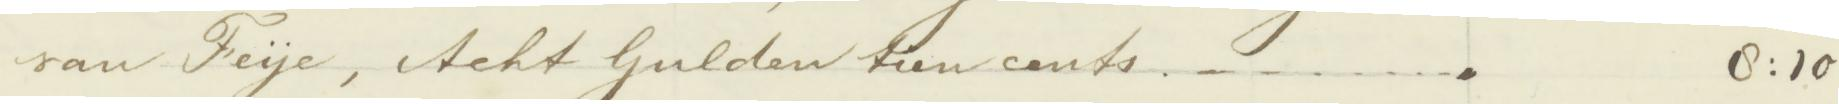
van Feije, Acht Gulden tien cents. - - . . . . - „ 8: 10
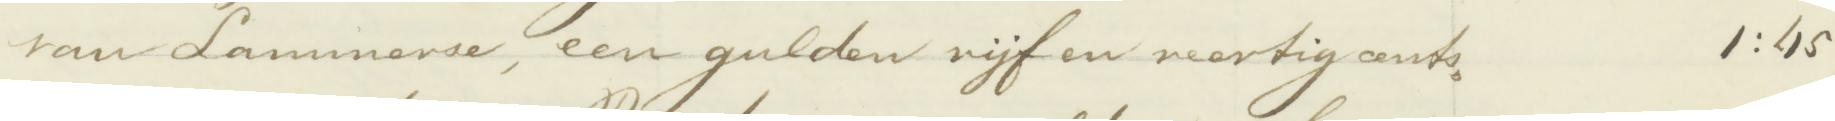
van Lammerse, een gulden vijf en veertig cents„ 1:45
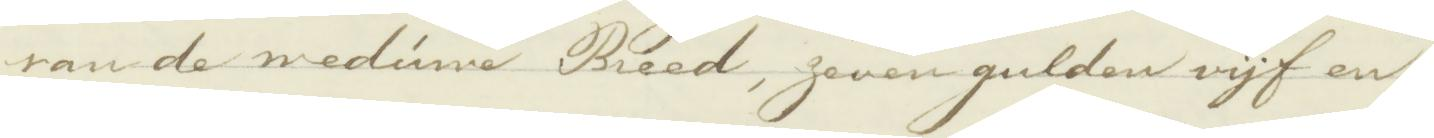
van de weduwe Breed, zeven gulden vijf en
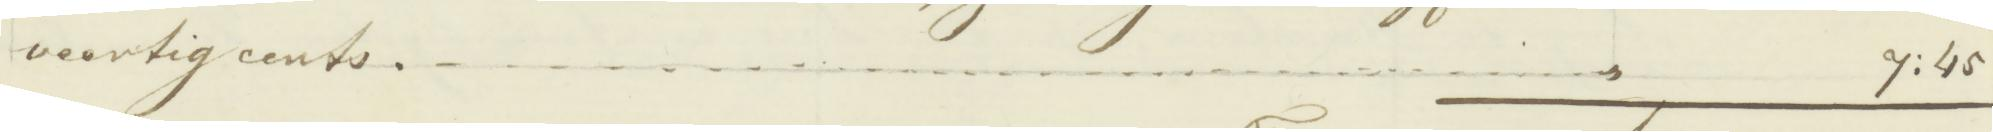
veertig cents. - - - - - - - - - - - - - - - - - - - - - - - - - - - - - - - - „ 7: 45
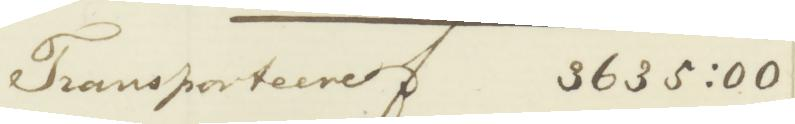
Transporteere ƒ 3635:00
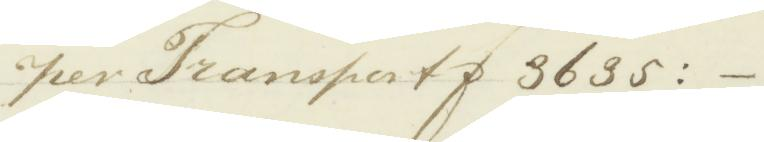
per Transport ƒ 3635: —
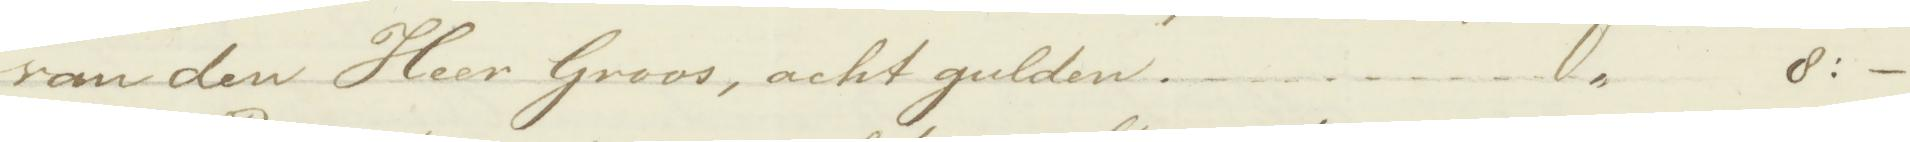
van den Heer Groos, acht gulden. - - - - - - - - - - „ 8: —
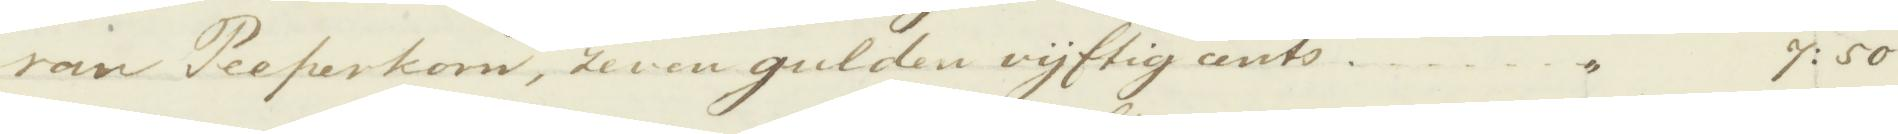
van Peeperkom, zeven gulden vijftig cents. - - - - - „ 7: 50
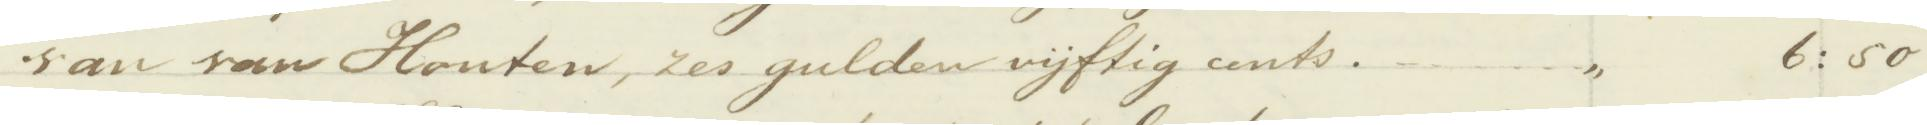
van van Houten, zes gulden vijftig cents. - - - - - - „ 6: 50
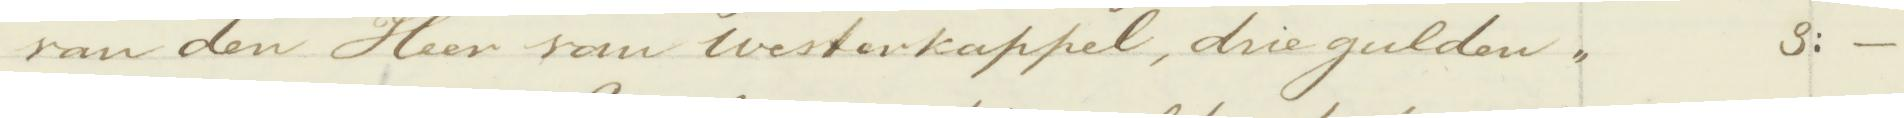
van den Heer van Westerkappel, drie gulden „ 3: —
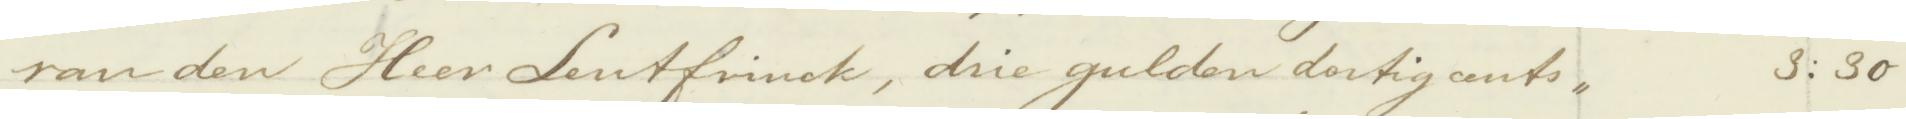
van den Heer Lentfrinck, drie gulden dertig cents „ 3: 30
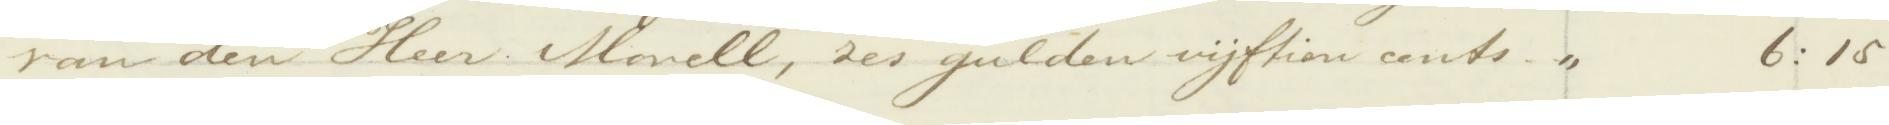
van den Heer Morell, zes gulden vijftien cents - „ 6: 15
